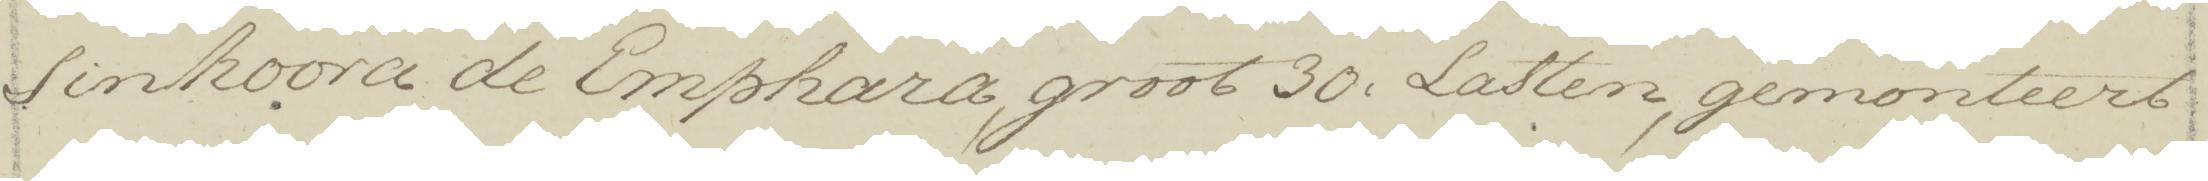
Sinhoora de Emphara, groot 30: Lasten, gemonteert
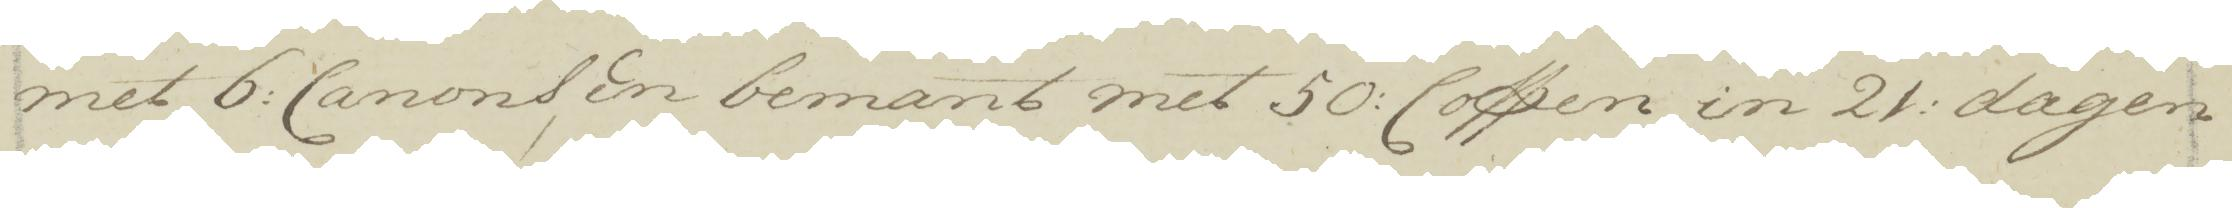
met 6: Canons, en bemant met 50: Coppen, in 21: dagen
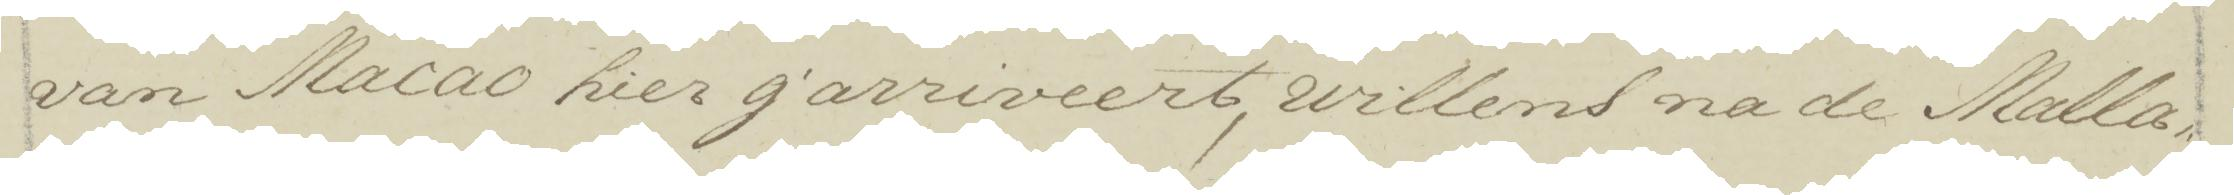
van Macao hier g’arriveert, willens na de Malla„
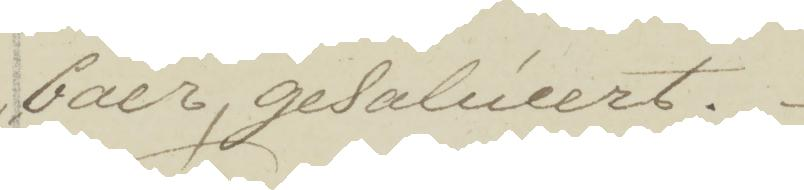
„baer, gesalueert.—
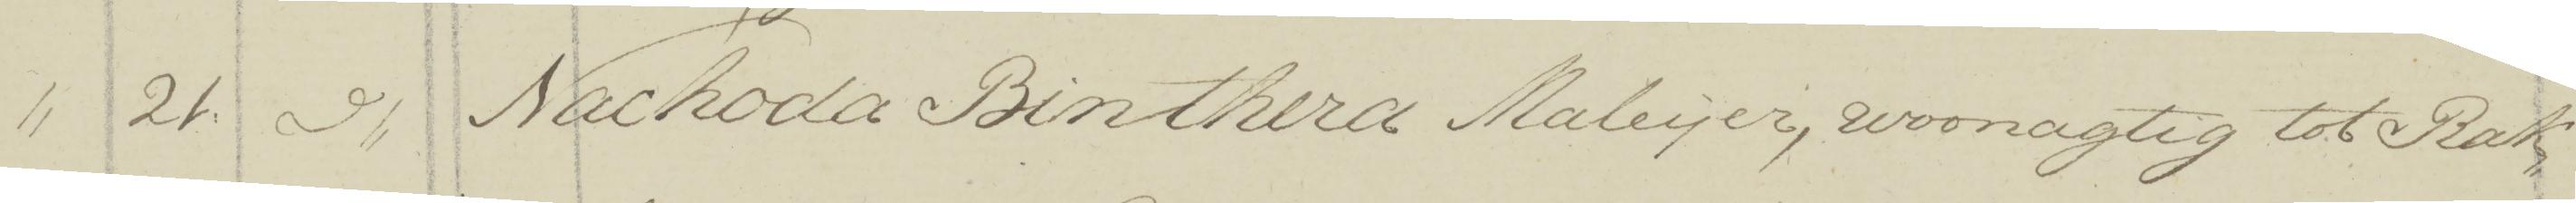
„ 21: d„o Nachoda Binthera Maleijer, woonagtig tot Rak„
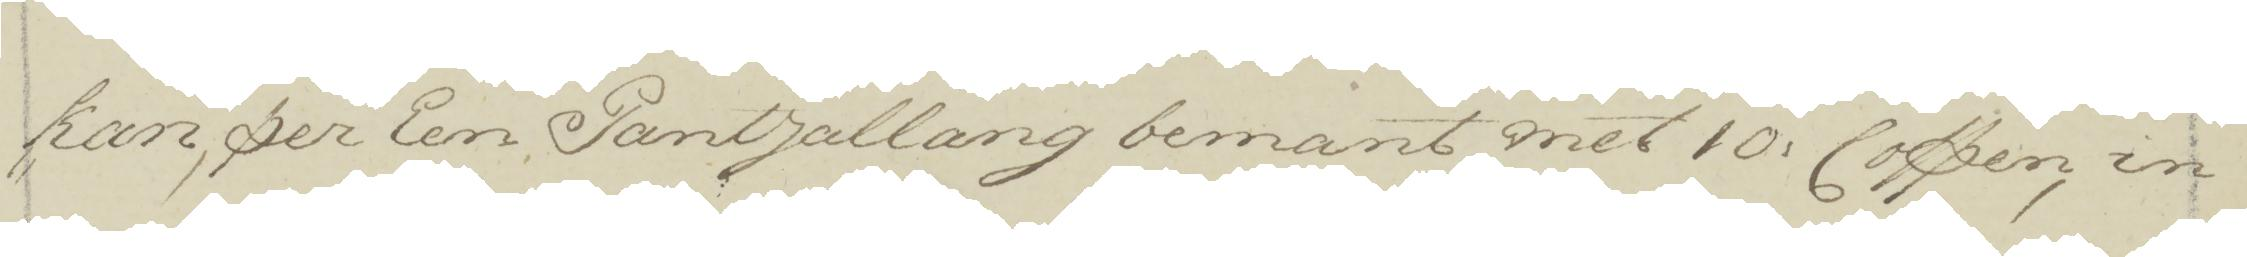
„dan, per Een Pantjallang bemant met 10: Coppen, in
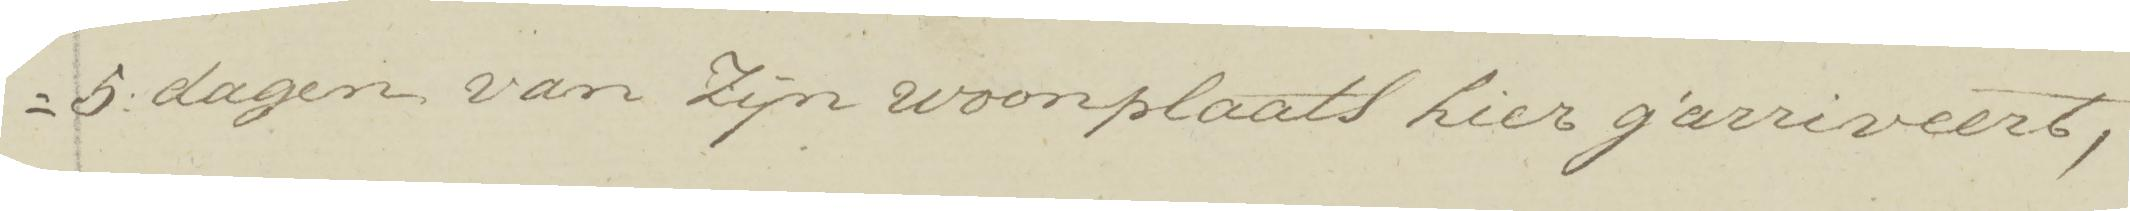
= 5: dagen van zijn woonplaats hier g'arriveert,
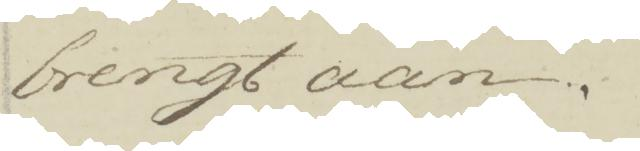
brengt aan.
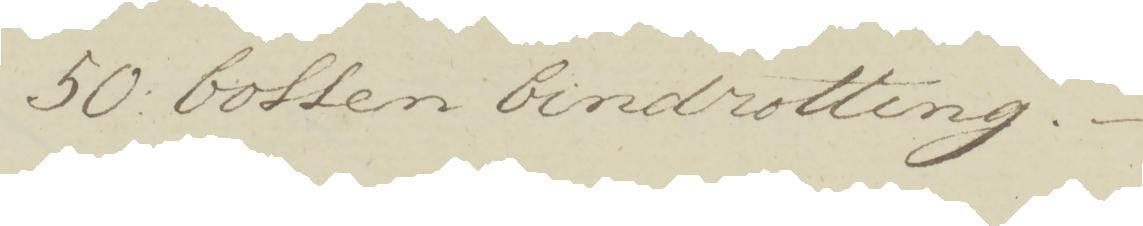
50: bossen bindrotting.—
